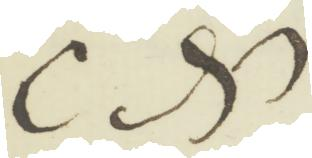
C N
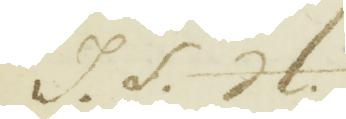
I. S. H:
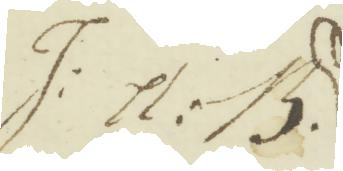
J: A: B:
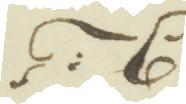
T: C
